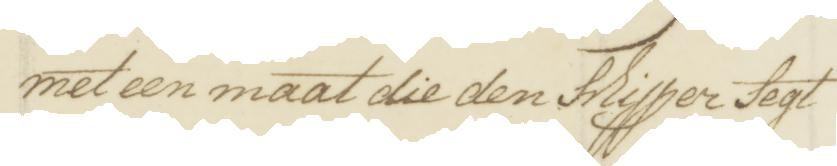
met een maat die den schipper Segt
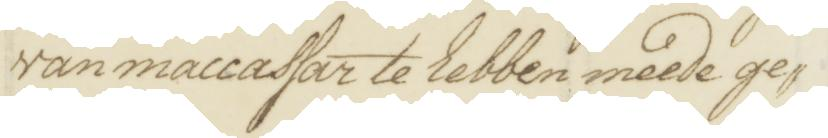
van maccassar te hebben meede ge„
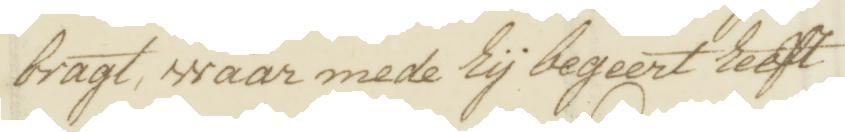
bragt, waar mede hij begeert heeft
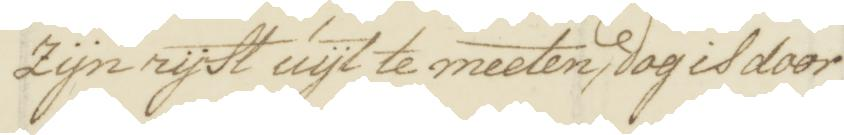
Zijn rijst uijt te meeten, dog is door
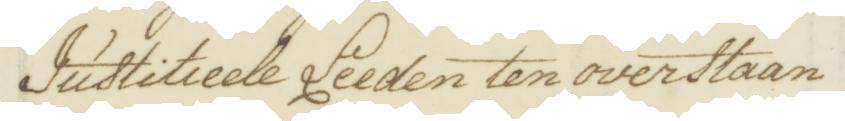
Justitieele Leeden ten overstaan
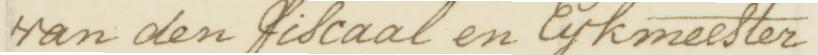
van den fiscaal en Eykmeester
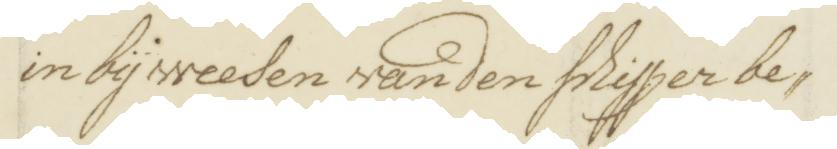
in bij weesen van den schipper be„
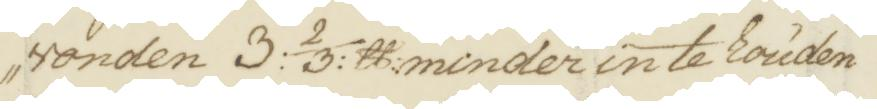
„vonden 3: 2/3: lb: minder in te houden
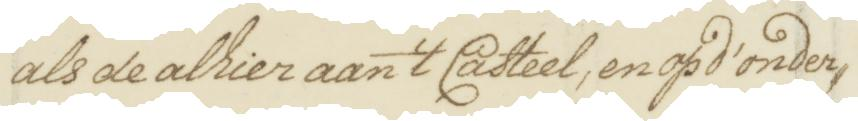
als de alhier aan ’t Casteel, en op d’ onder„
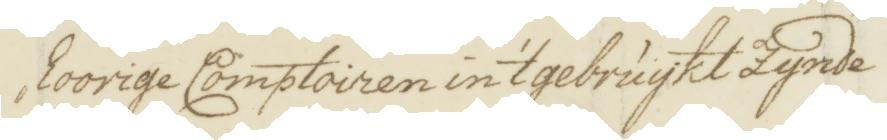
„hoorige Comptoiren in ’t gebruijkt Zynde
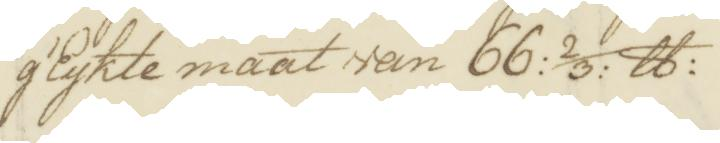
g'Eykte maat van 66: 2/3: lb:
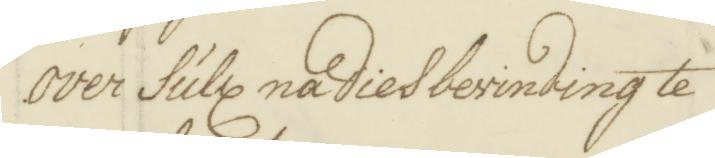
over sulx na dies bevinding te
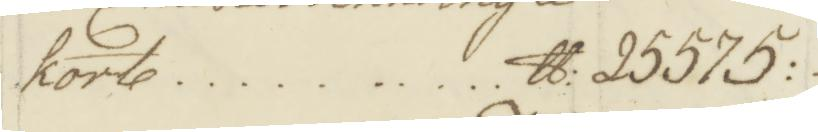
kort . . . . . . . . .lb: 25575: —
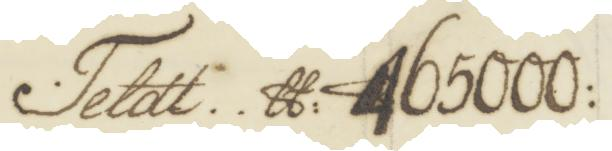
Teldt . . lb: 465000:
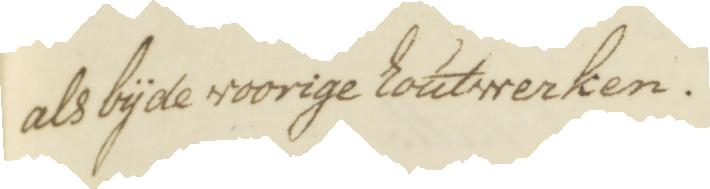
als bij de voorige houtwerken.
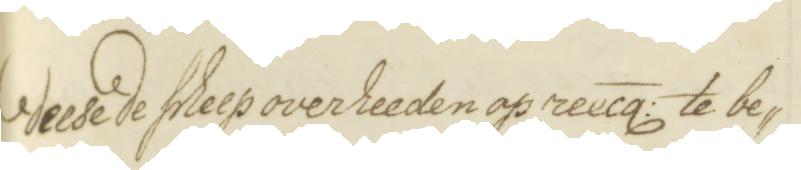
deese de scheep overheeden op reecq: te be„
